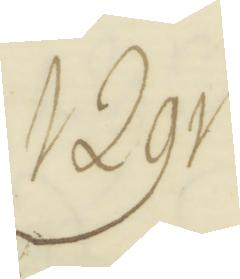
1291
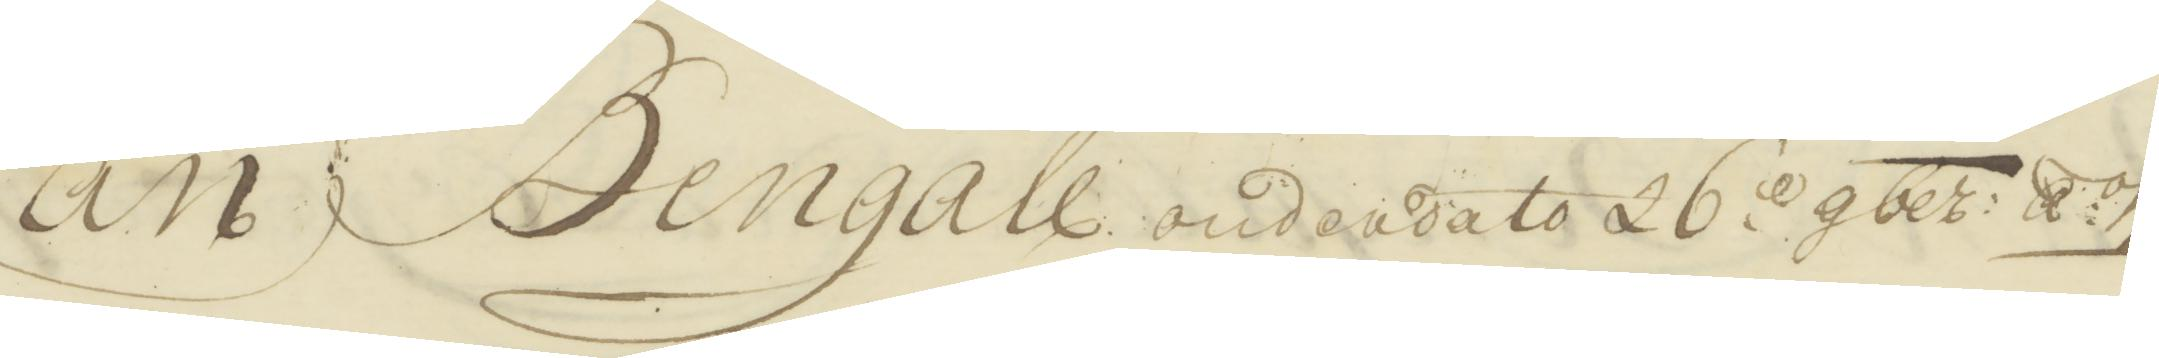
Van Bengale onder dato 26,e 9ber: a:o 1741:/:
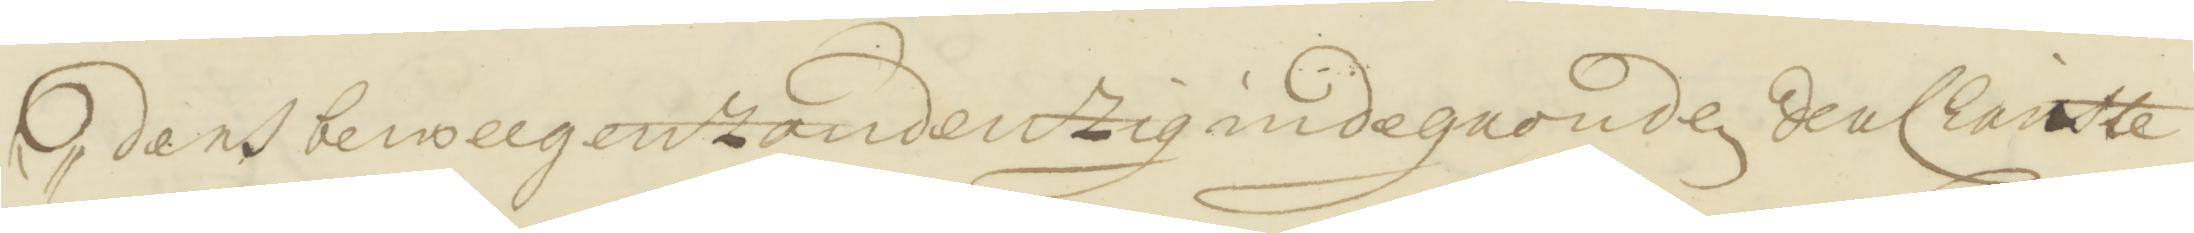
dens beweegen zouden zig in de gronden der Christe
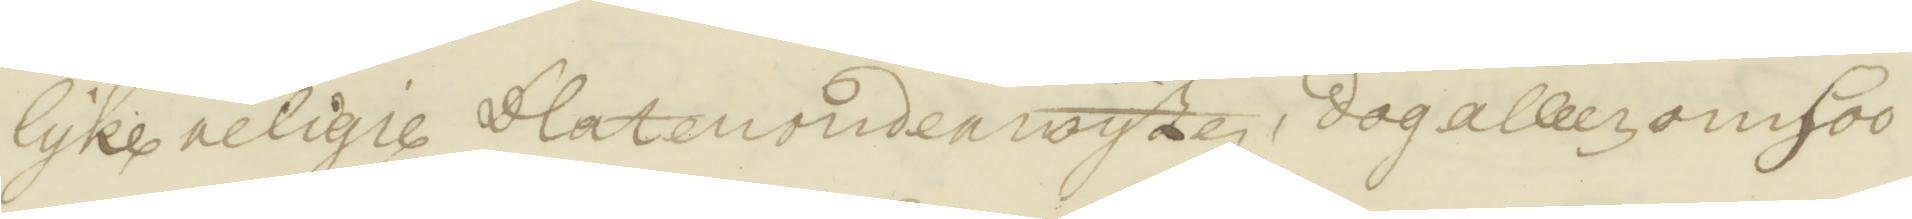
lijke religie te laten onderwijzen, dog alleen om soo
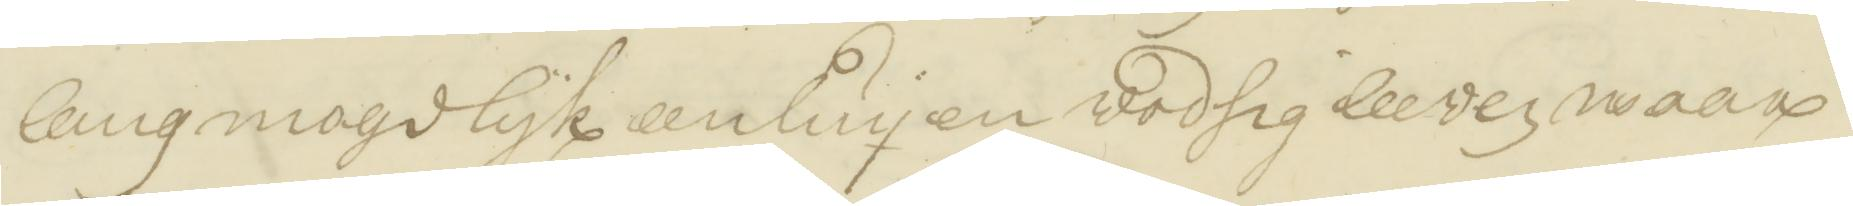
lang mogelijk een luij en vodsig leeven waar
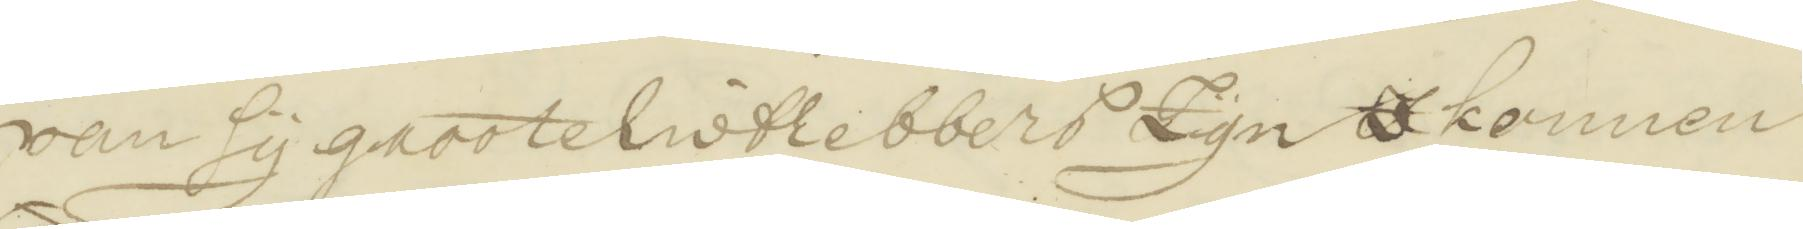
van sij groote liefhebbers zijn te konnen
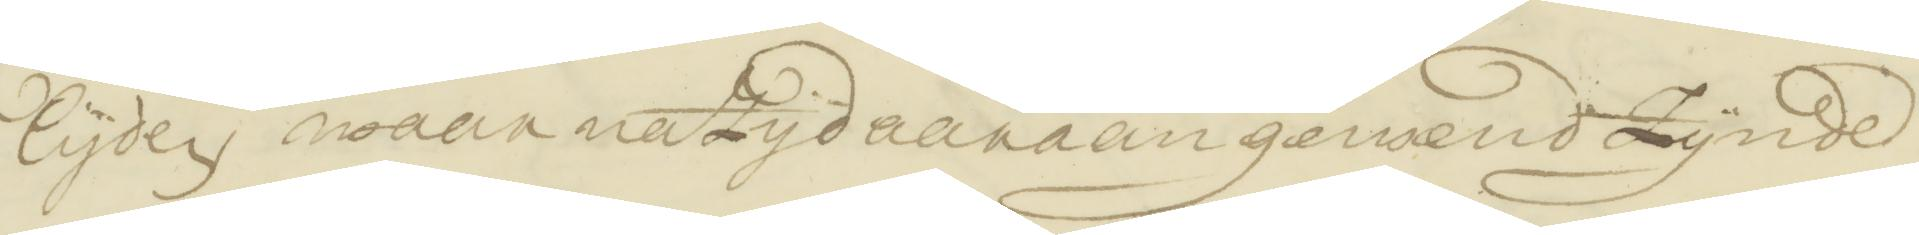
lijden, waar na zij daaraan gewend zijnde
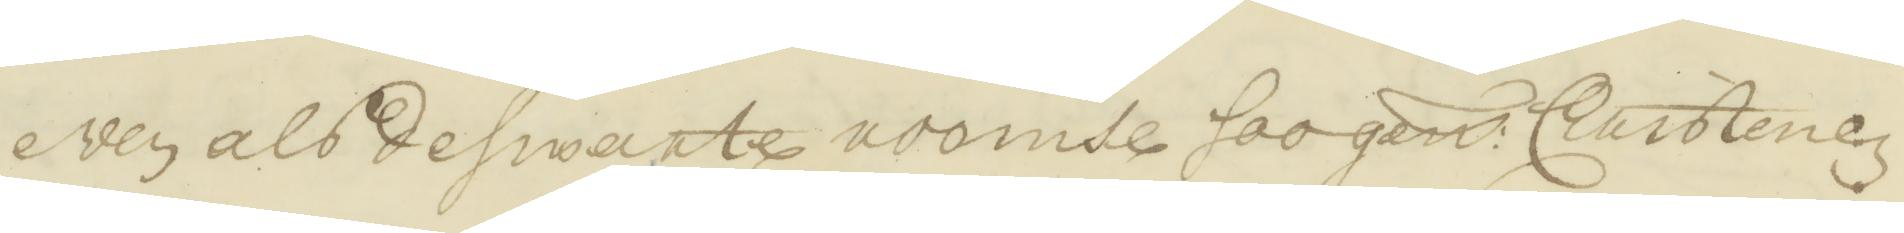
even als de swarte roomse soo gen: Christenen
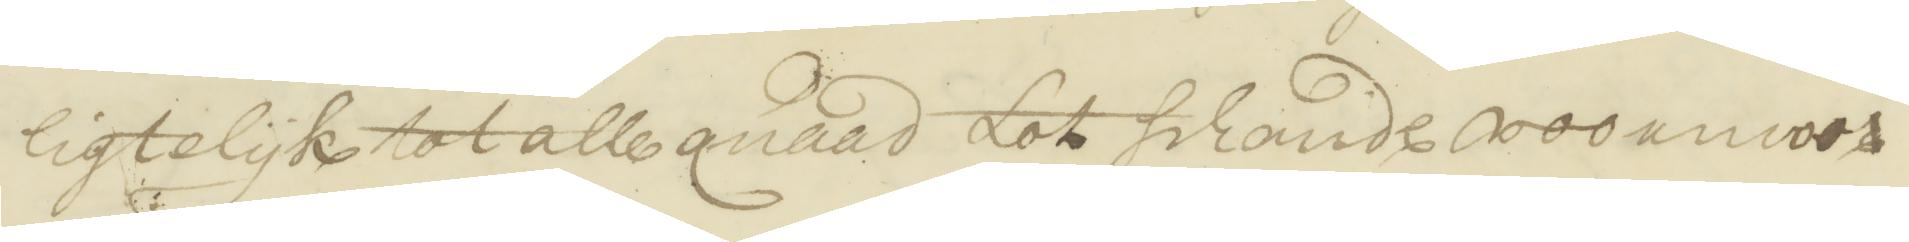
ligtelijk tot alle quaad tot schande voor moor
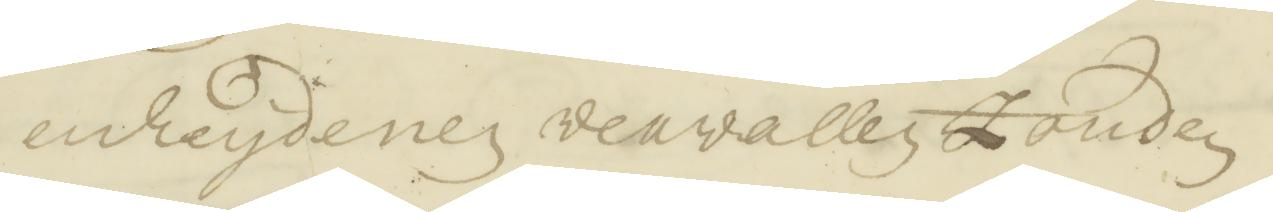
en heijdenen vervallen zouden.
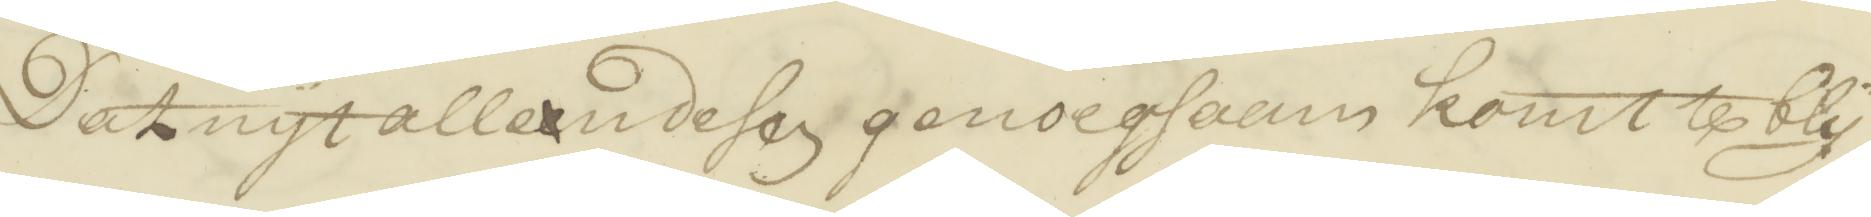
Dat uijt alleen dese genoegsaam komt te blij„
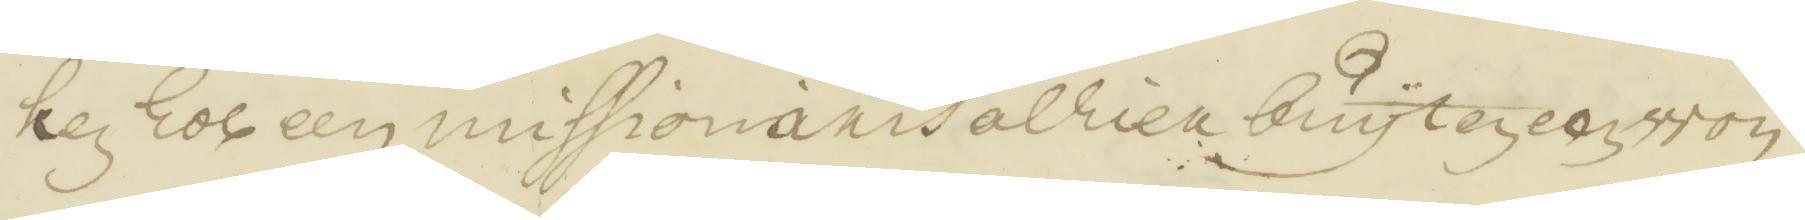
ken hoe een missionaris alhier buijten een won
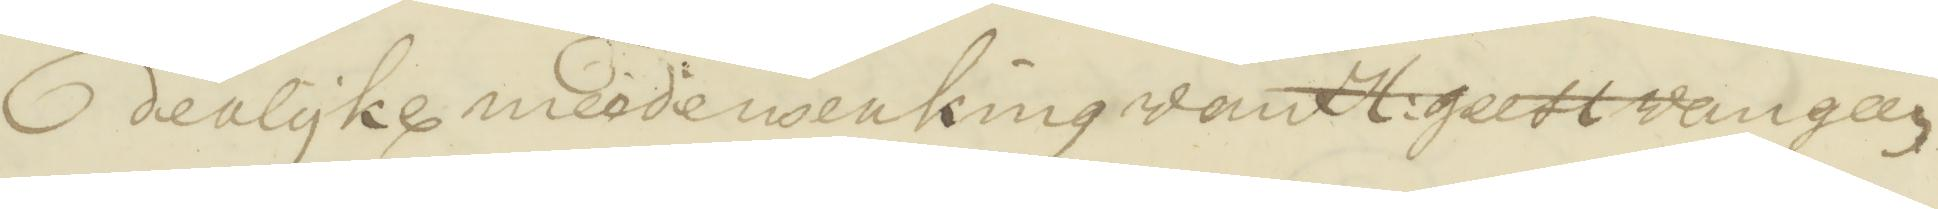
derlijke meedewerking van H: geeft van geen
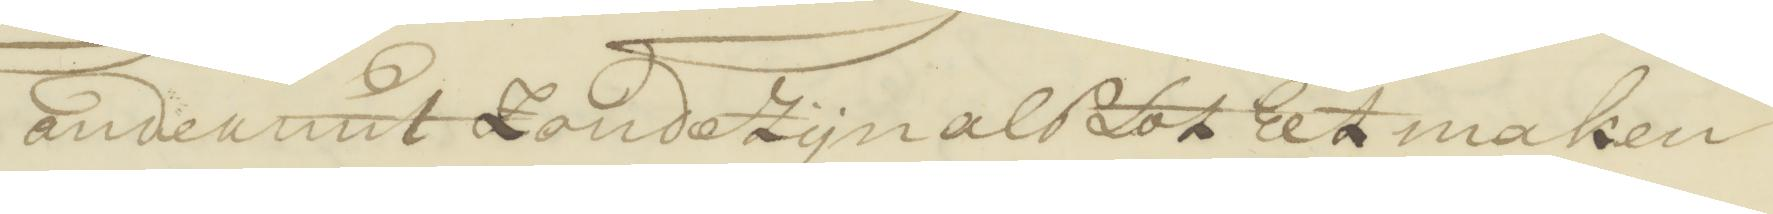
ander nut zoude zijn als tot het maken
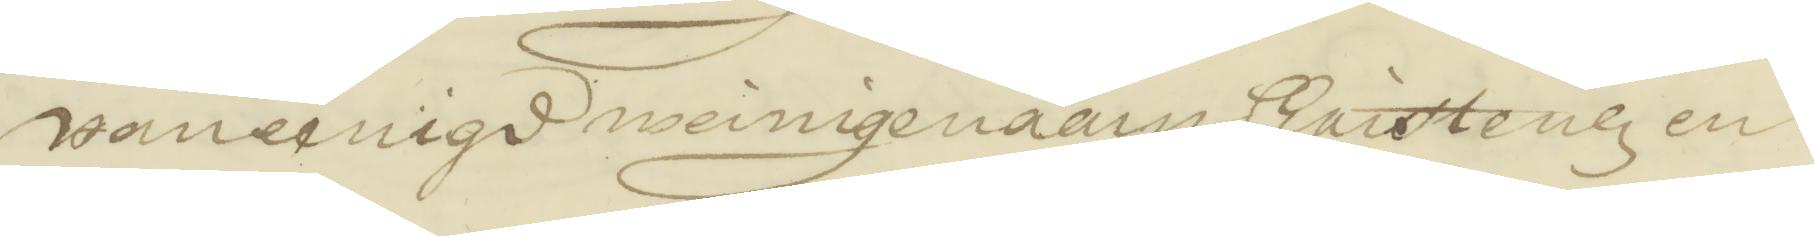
van eenige weinige naam Christenen en
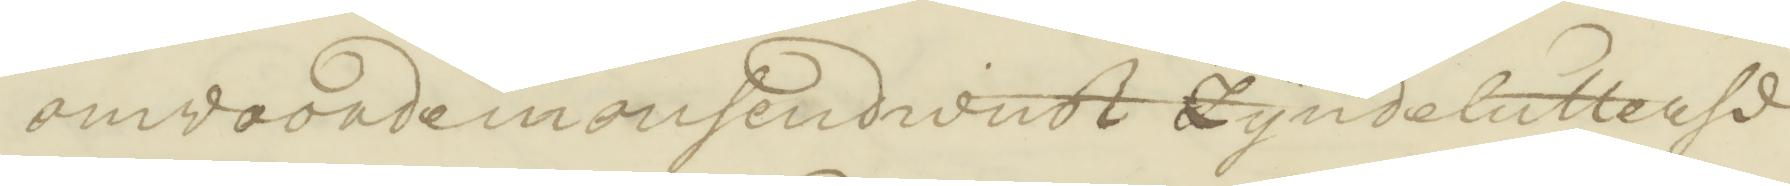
om voor de in onsen dienst zijnde lutterse
